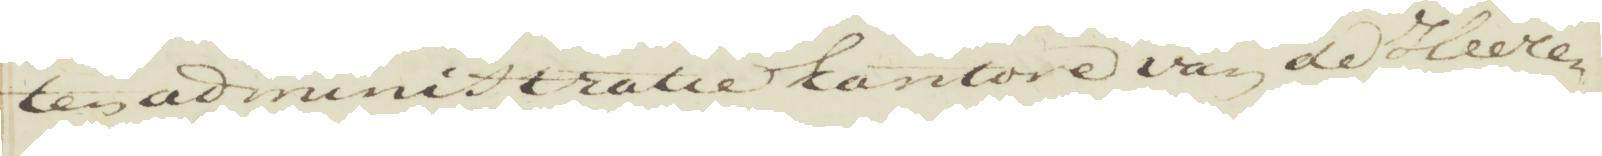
ten administratie kantore van de Heeren
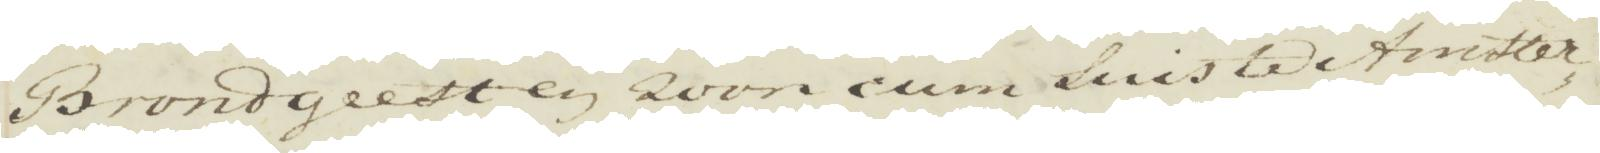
Brondgeest en zoon cum suis te Amster„
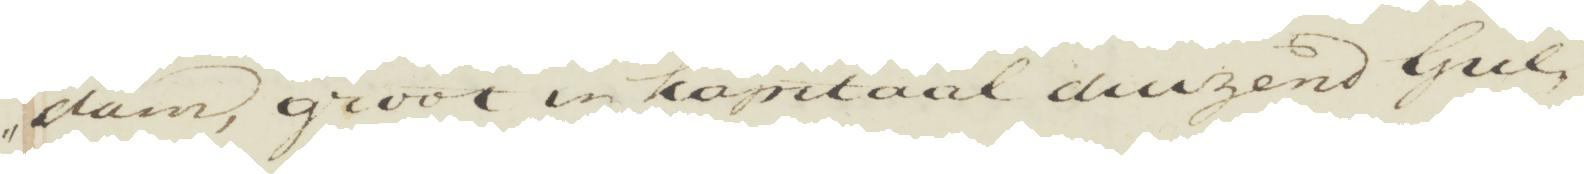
„dam, groot in kapitaal duizend Gul„
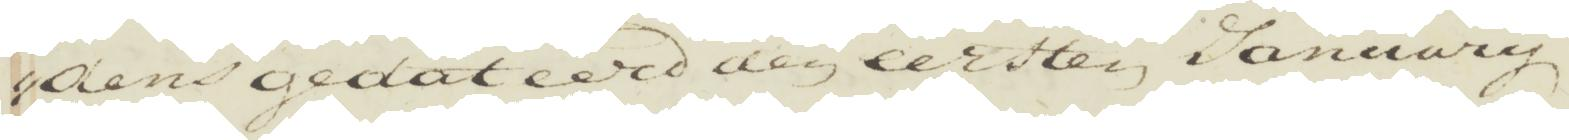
„dens gedateerd den eersten Januarij
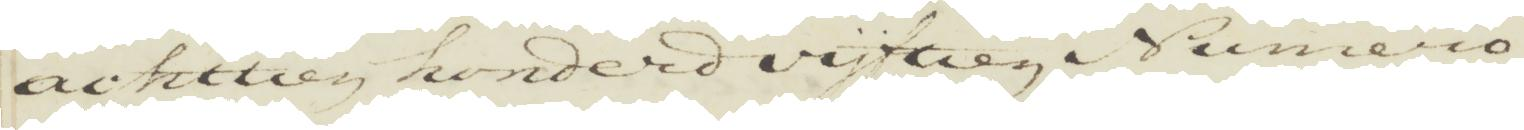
achttien honderd vijftien Numero
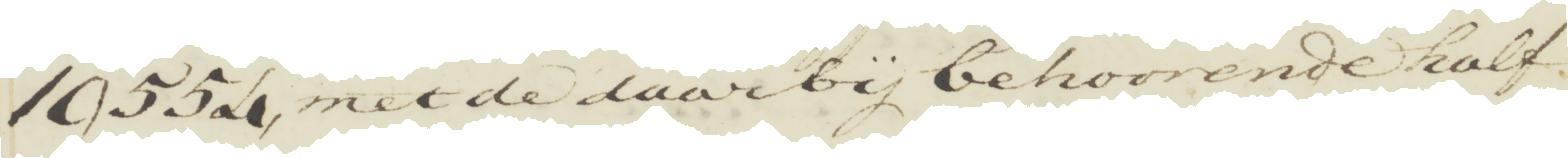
19554, met de daarbij behoorende half
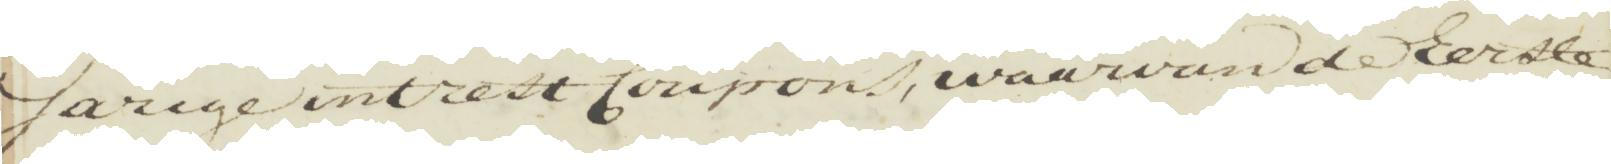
„jarige intrest Coupons, waarvan de Eerste
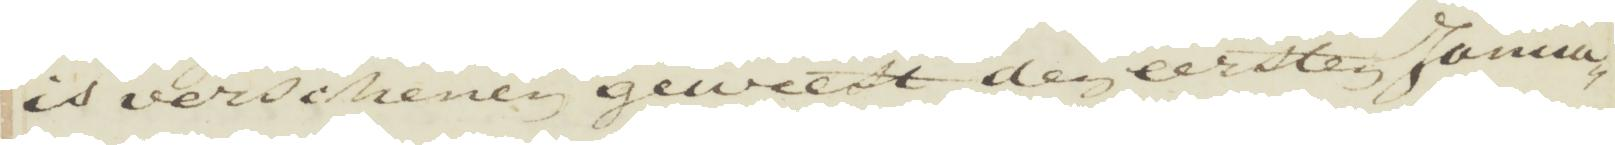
is verschenen geweest den eersten Janua„
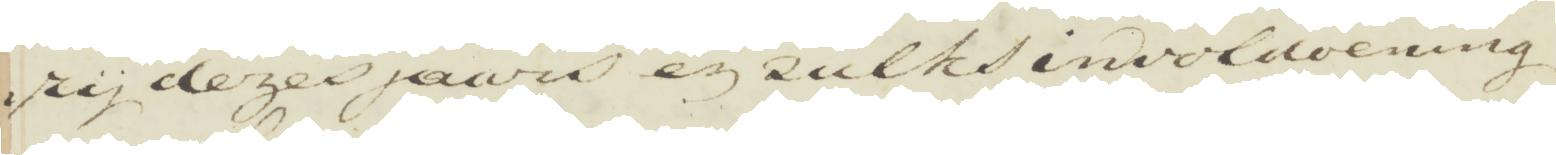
rij dezes jaars en zulks in voldoening
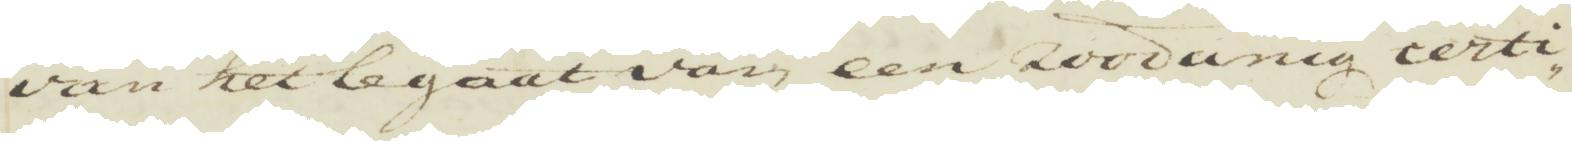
van het legaat van een zoodanig certi„
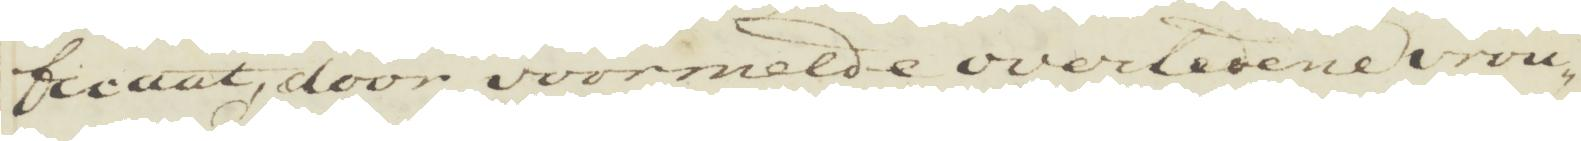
ficaat, door voormelde overledene vrou„
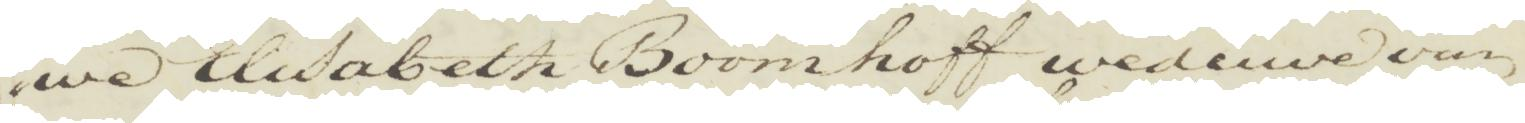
we Elisabeth Boomhoff weduwe van
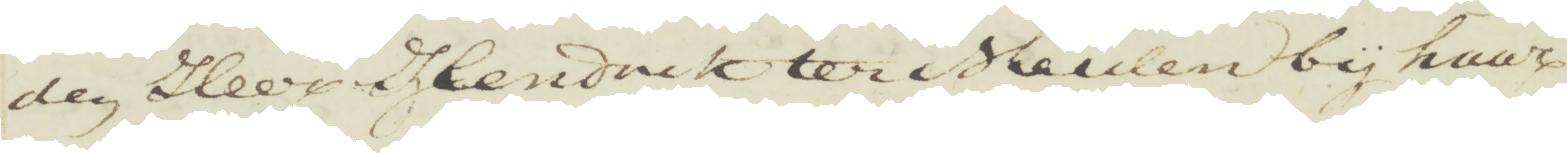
den Heer Hendrik ter Meulen bij haar
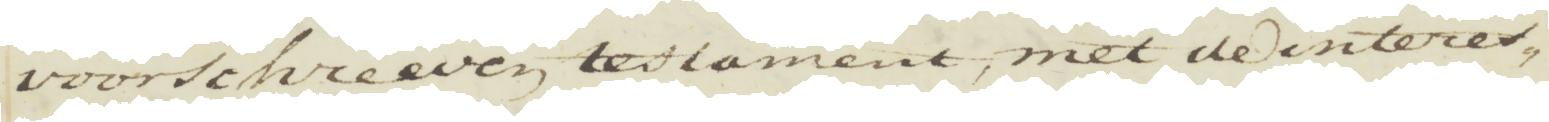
voorschreeven testament, met de interes„
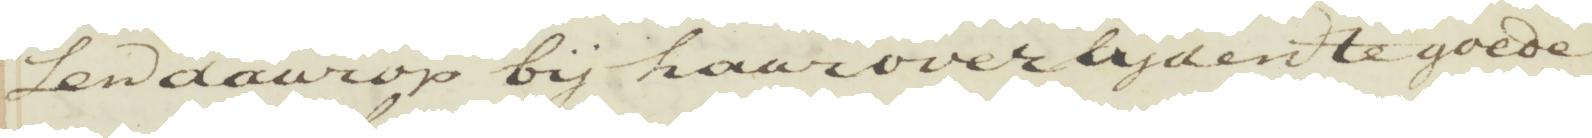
sen daarop bij haar overlyden te goede
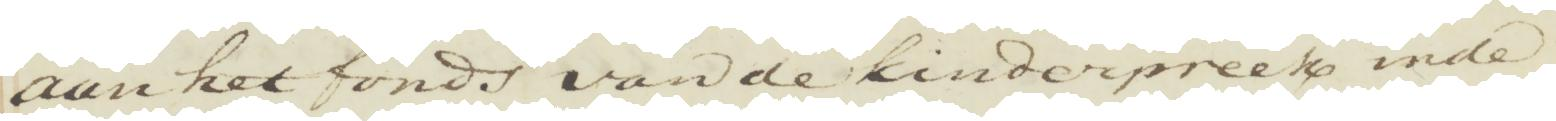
aan het fonds van de kinderpreek inde
